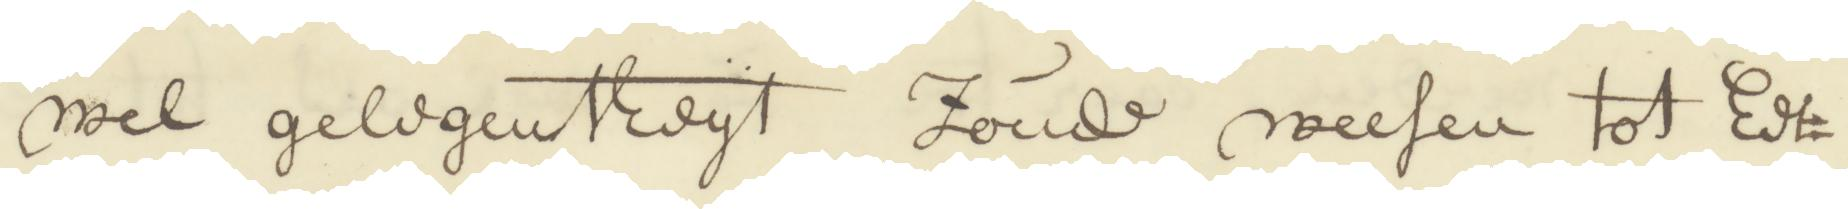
wel gelegentheijt zoude weesen tot het
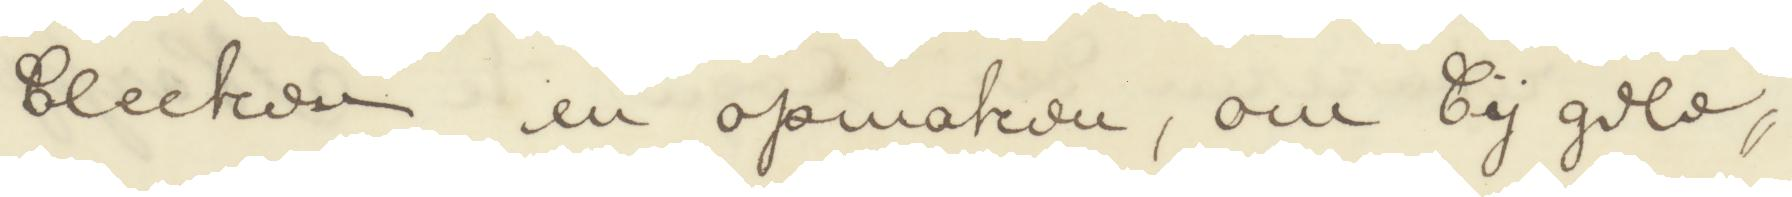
bleeken en opmaken, om bij gele„
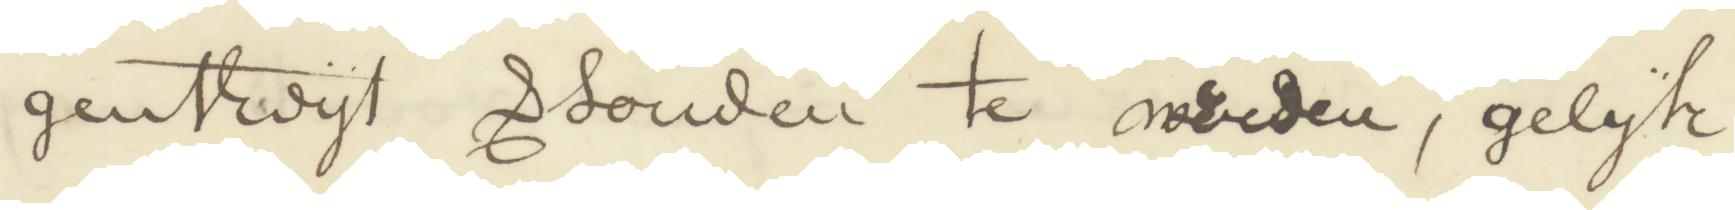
gentheijt versonden te werden, gelijk
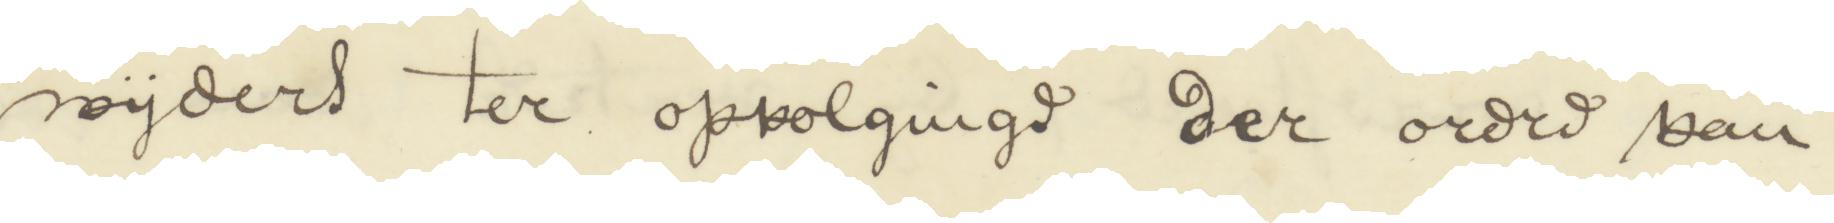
wijders ter opvolginge der ordre van
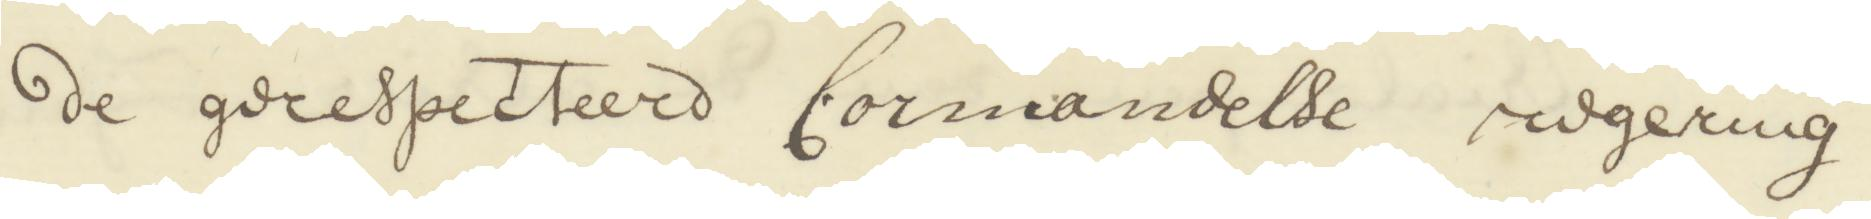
de gerespecteerd Cormandelse regering
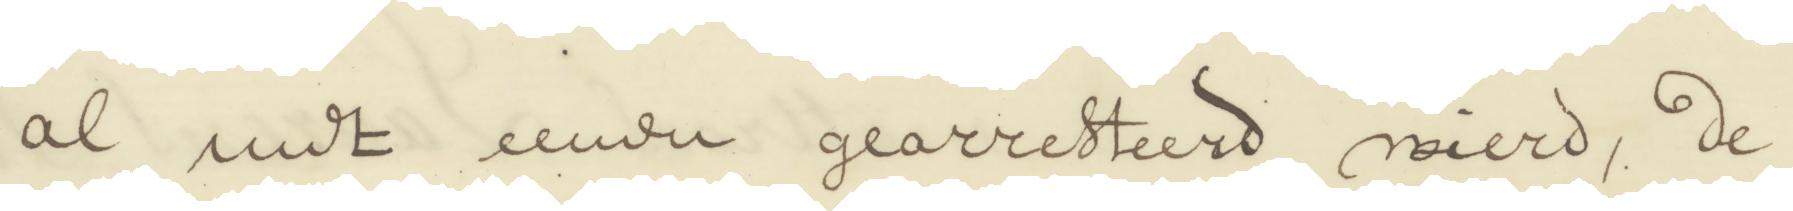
al met eenen gearresteerd wierd, de
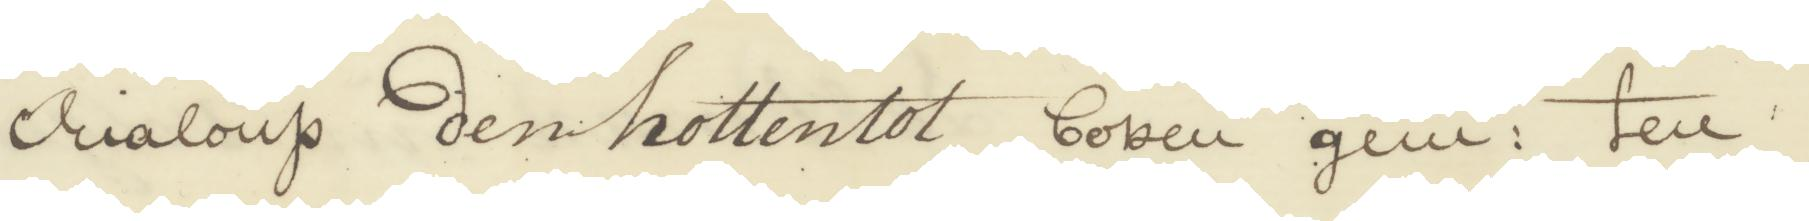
chialoup den hottentot boven gem: ten
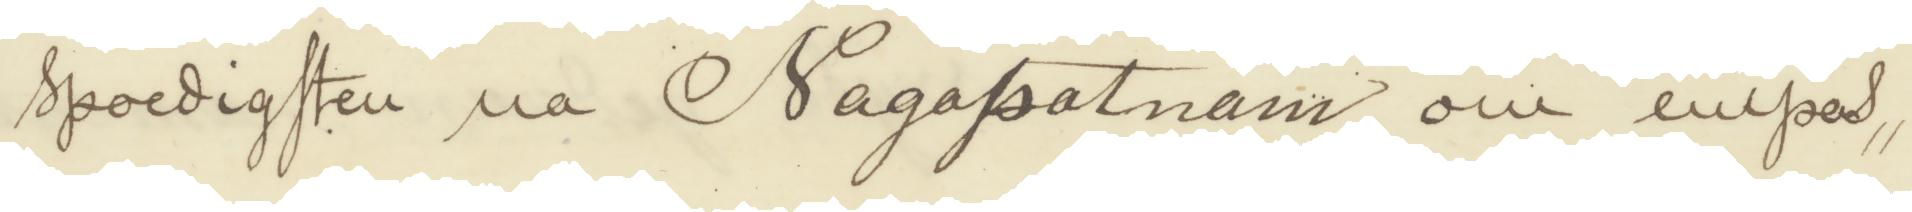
spoedigsten na Nagapatnam om empas„
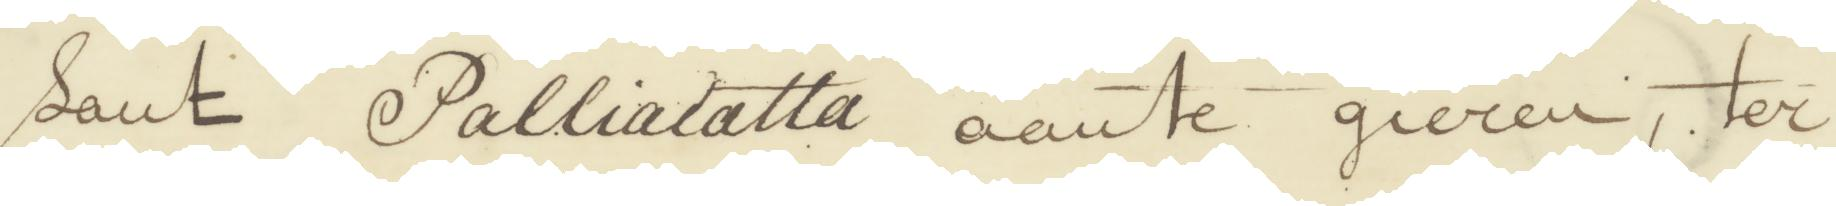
sant Palliacatta aante gieren, ter
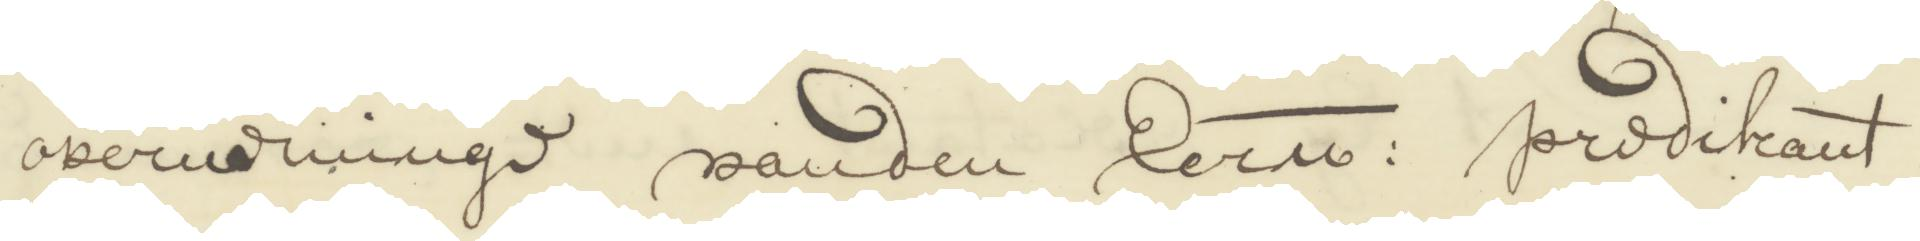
overneminge vanden Eerw: predikant
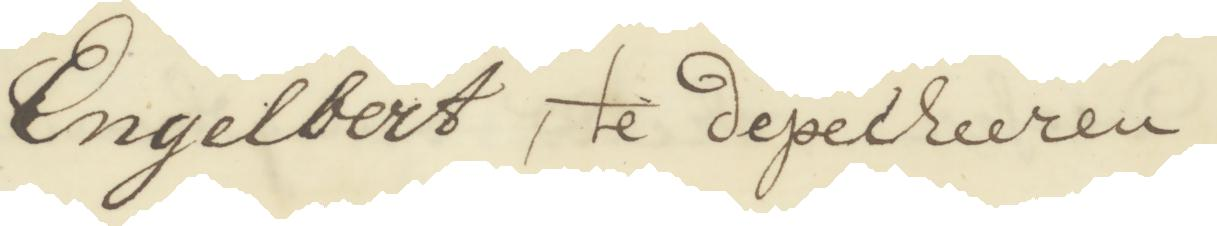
Engelbert, te depecheeren
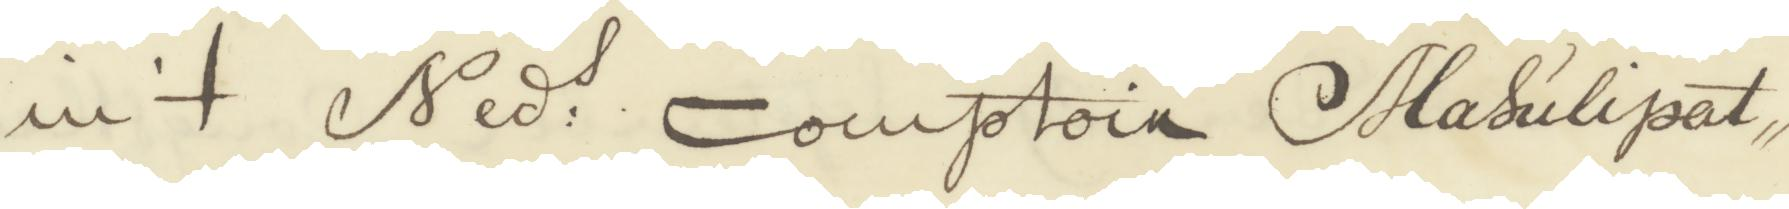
in ’t Ned:s Comptoir Masulipat„
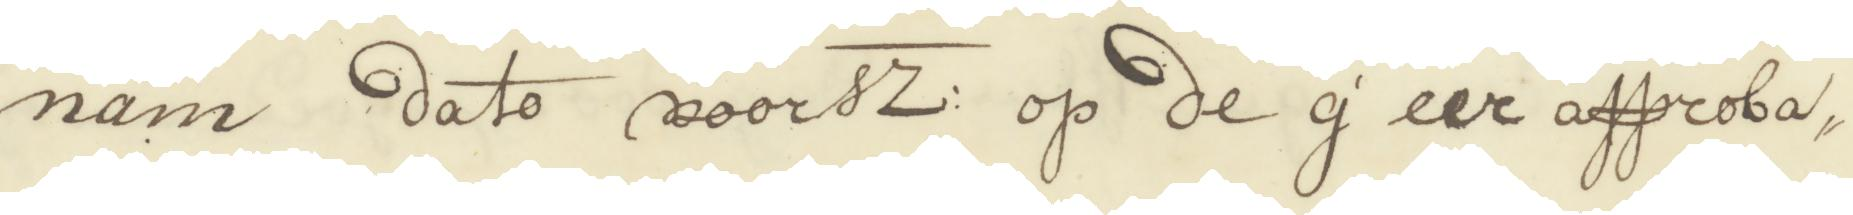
nam dato voorsz: op de g’ eer approba„
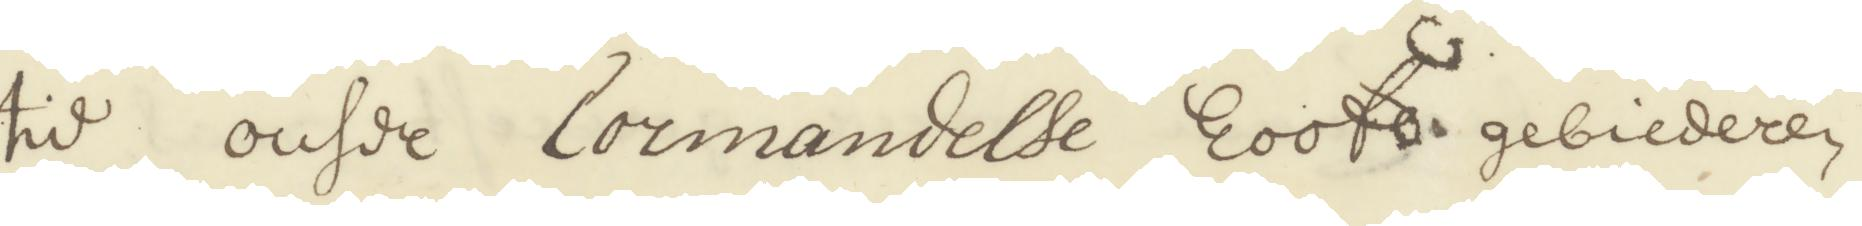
tie onser Cormandelse hoofd gebiederen
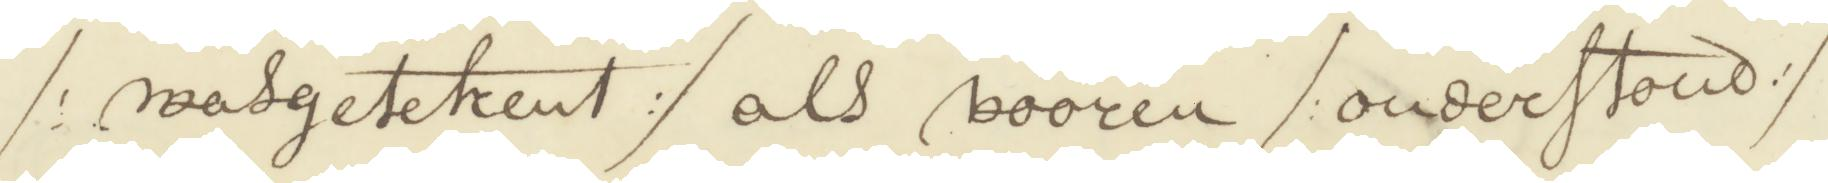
/:was getekent:/ als vooren /:onderstond:/
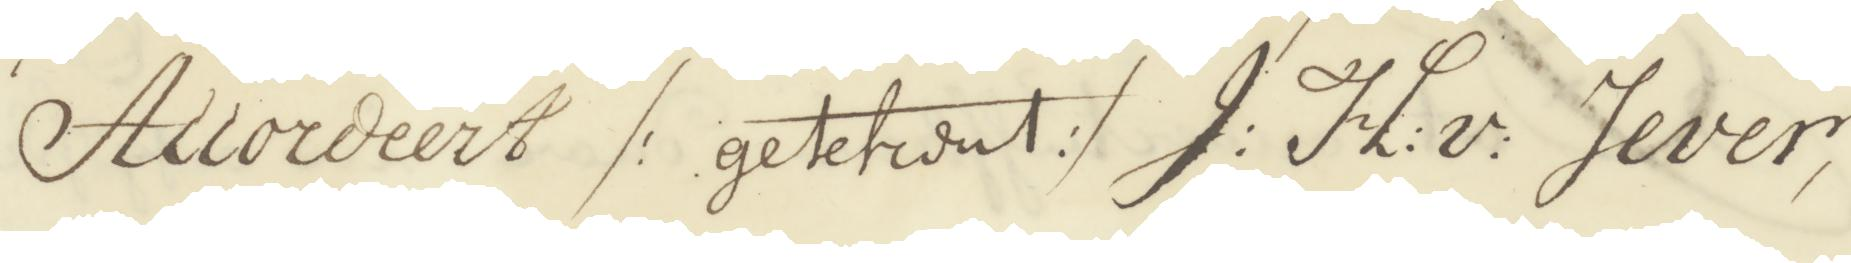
Accordeert /:getekent:/ J: H: v: Jever,
